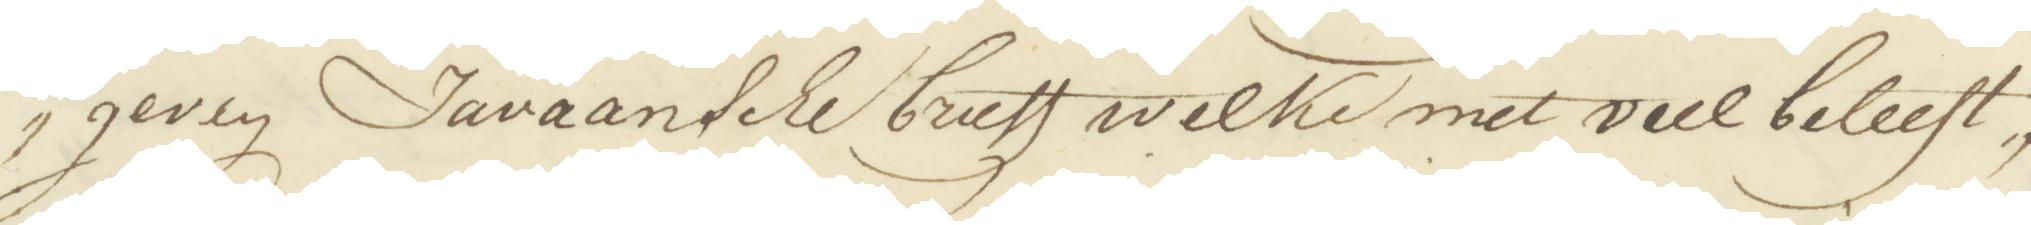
„geven Javaansche brieff welke met veel beleeft
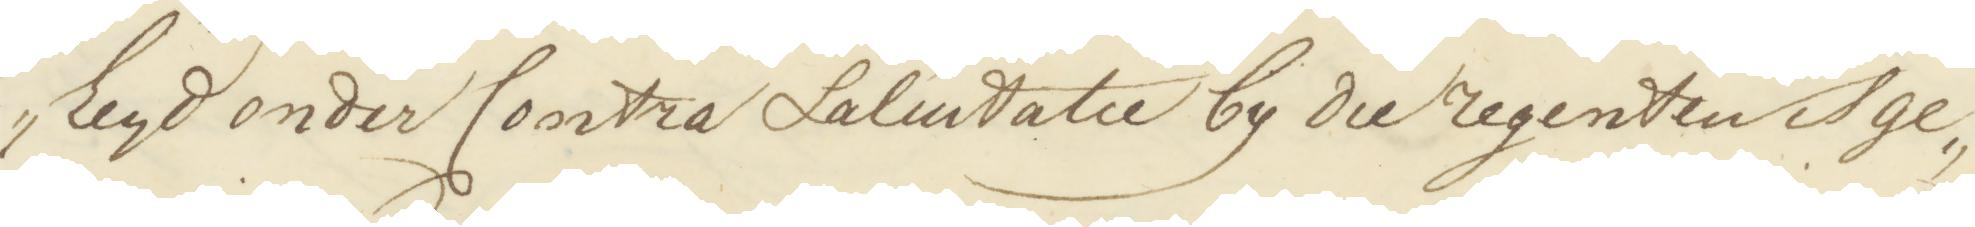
„heijd onder Contra Saluitatie bij die regenten is ge„
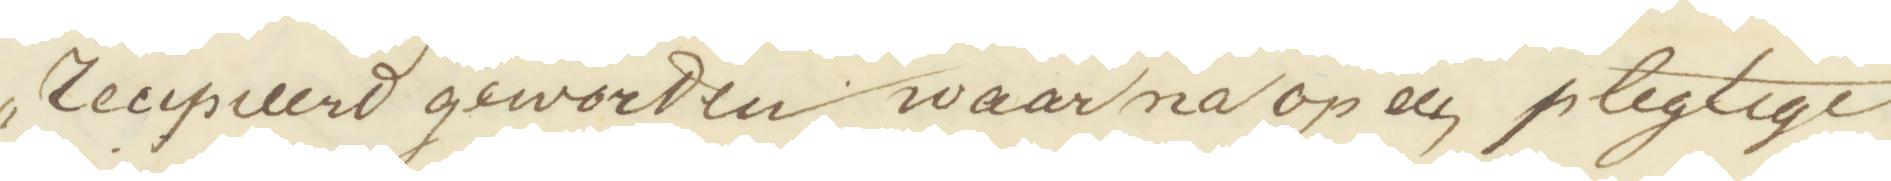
recipieerd geworden; waar na op een plegtige
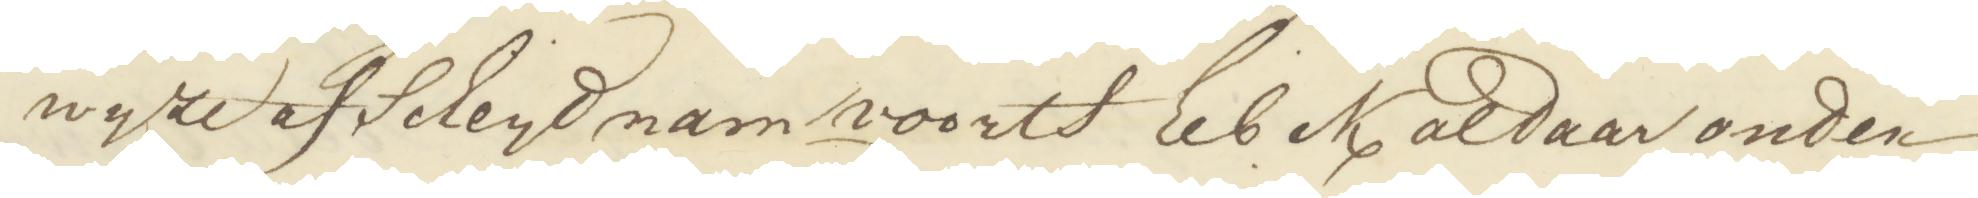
wijze afscheijd nam voorts heb ik aldaar onder
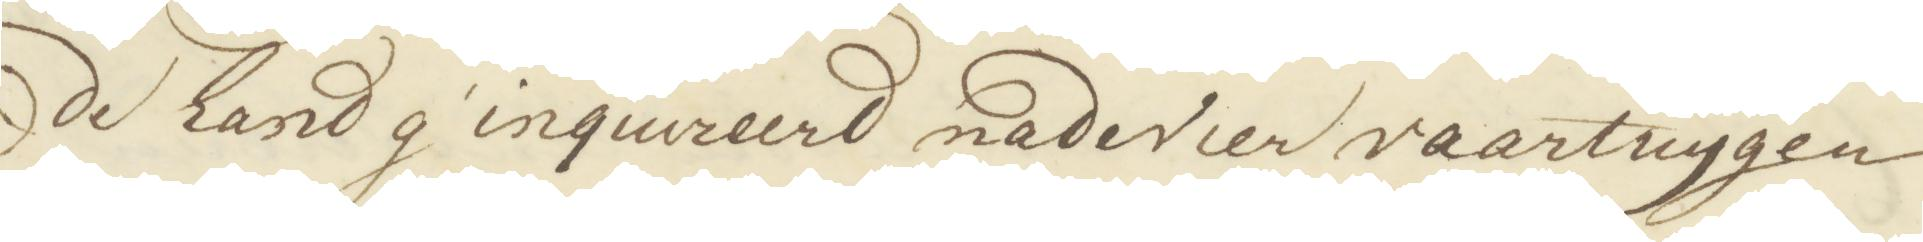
de hand g'inquireerd na de vier vaartuijgen
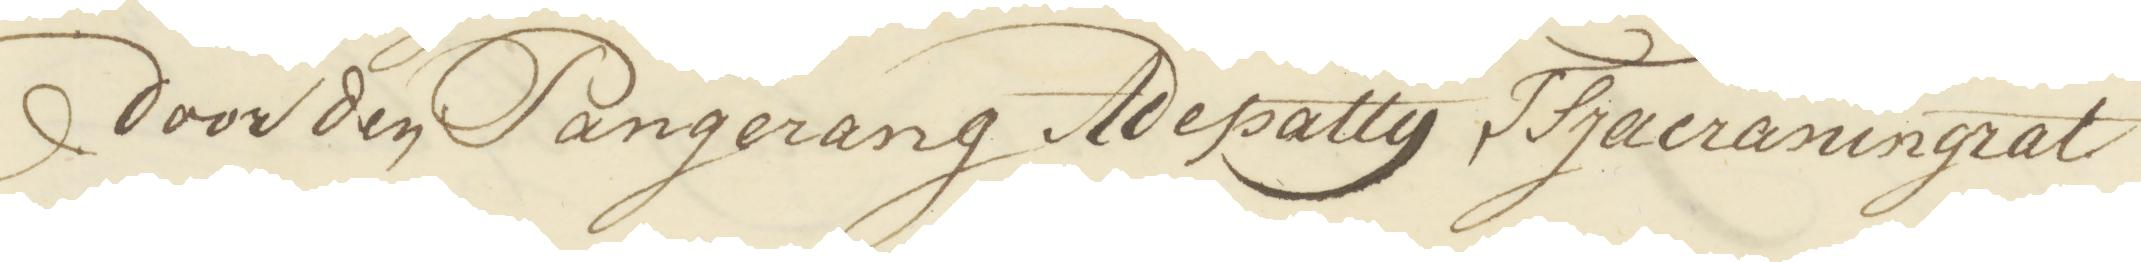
door den Pangerang Adepattij Tsjacraningrat
